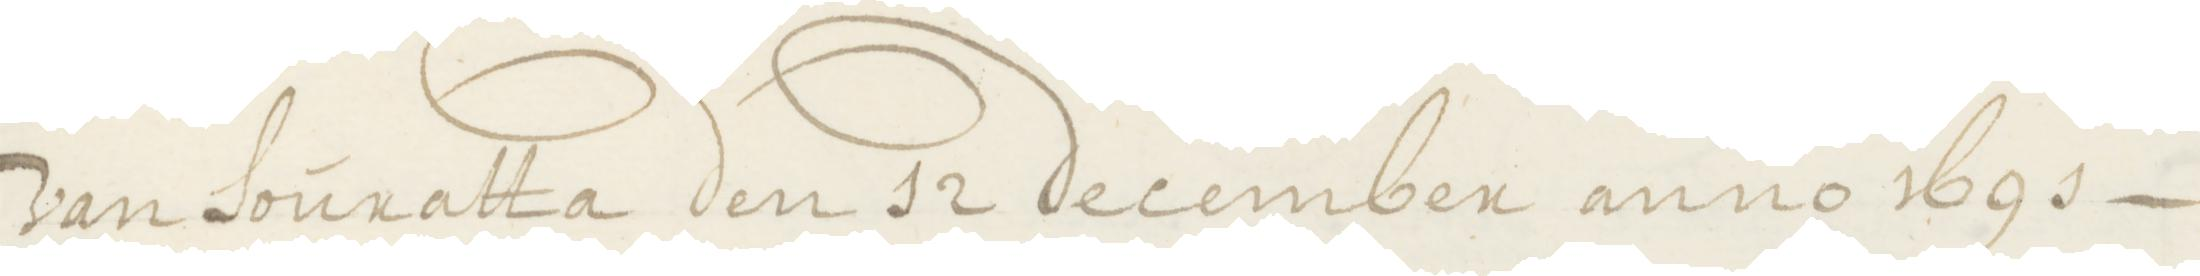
Van Souratta den 12 december anno 1691 —
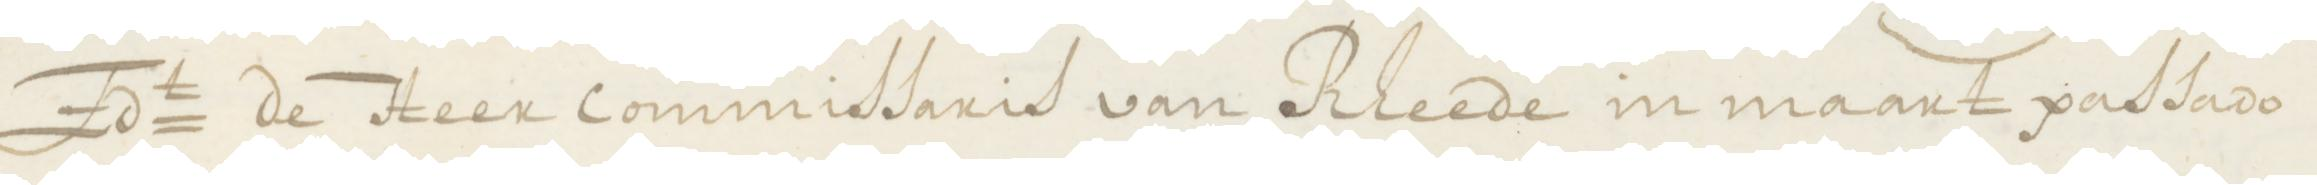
Ed=t de Heer commissaris van Rheede in maart passado
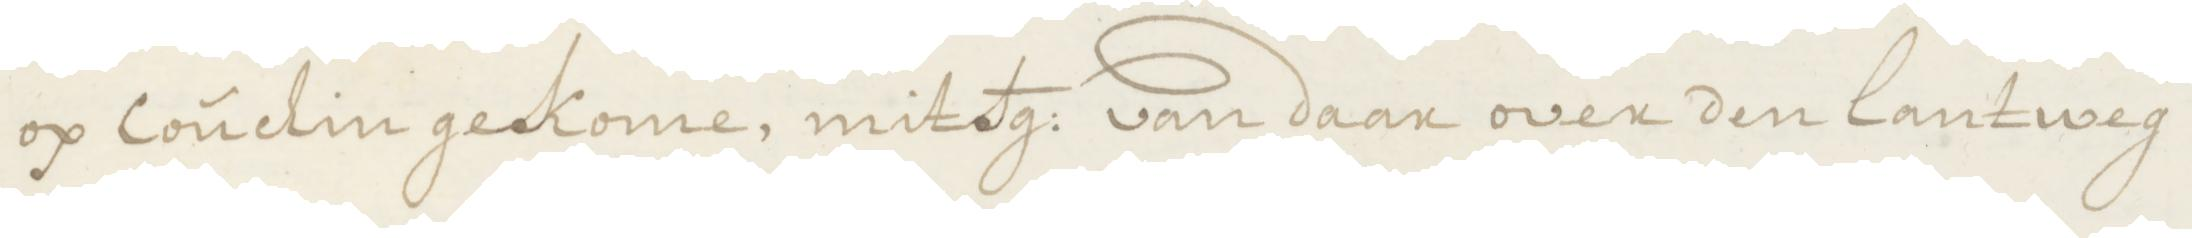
op Couchin gekome, mitsg: van daar over den lantweg
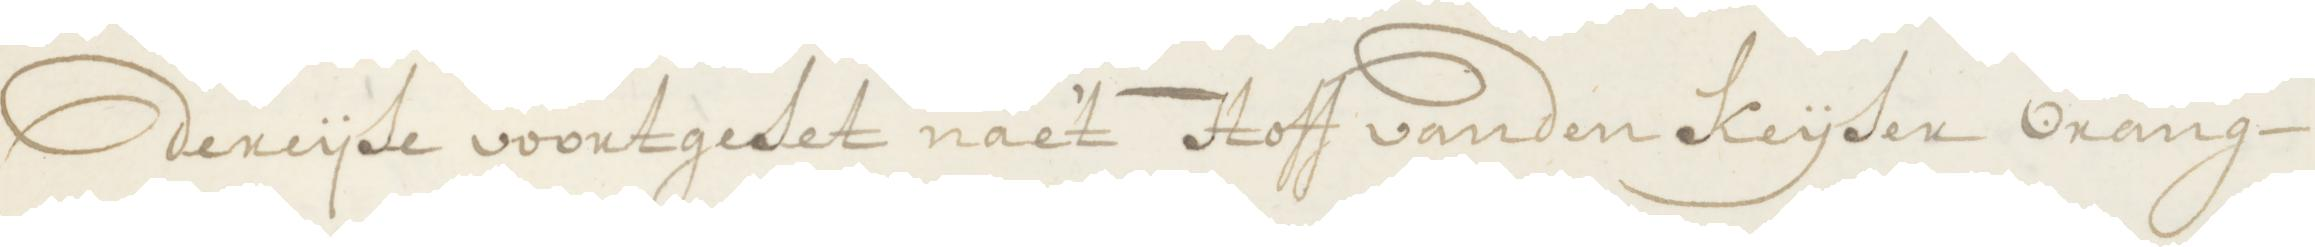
dereijse voortgeset nae't Hoff van den keijser Orang —
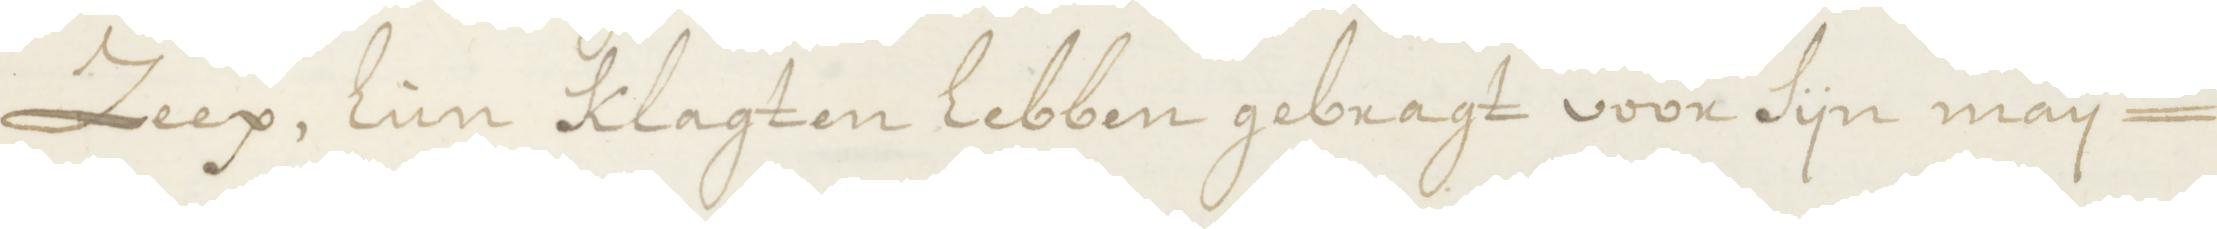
zeep, hun klagten hebben gebragt voor sijn maij=t
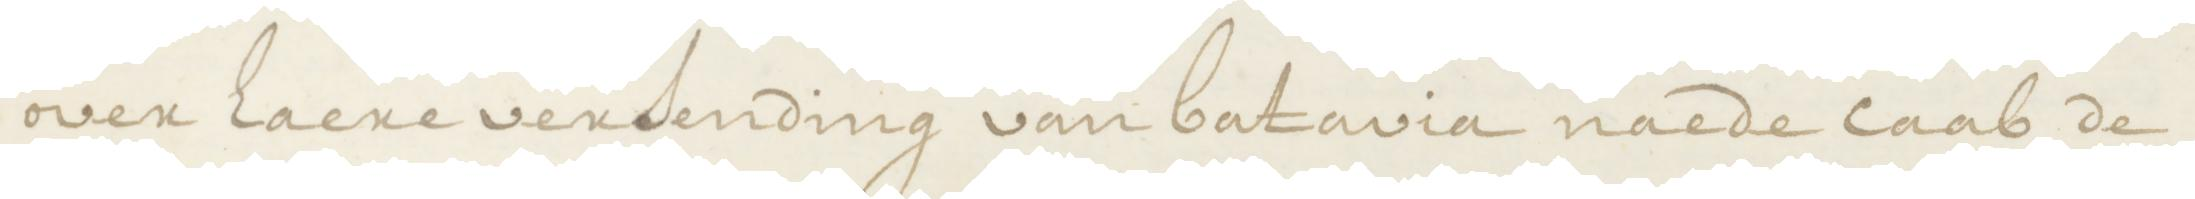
over haere versending van batavia naede caab de
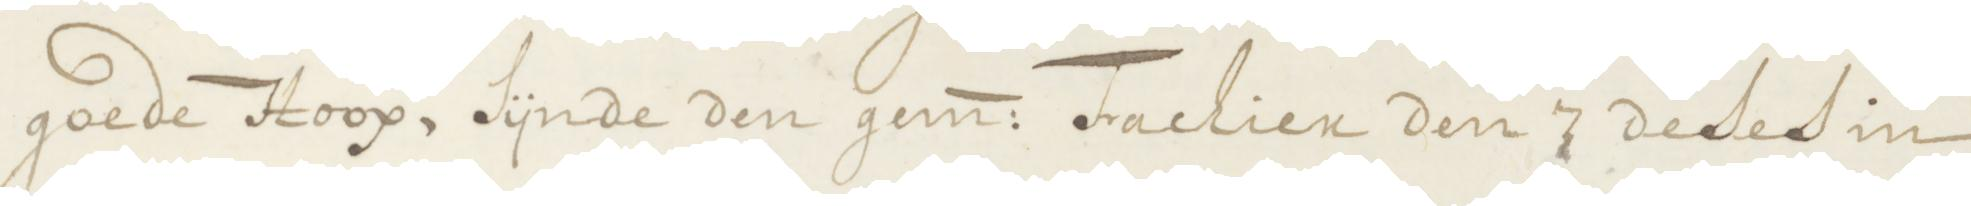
goede Hoop, sijnde den gem: Fachier den 7 deses in
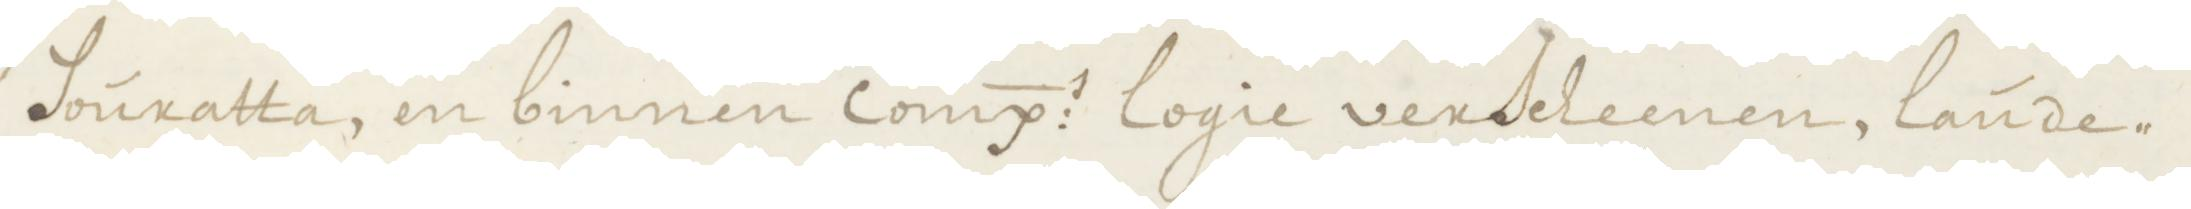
souratta, en binnen Comp:s logie verscheenen, laude„
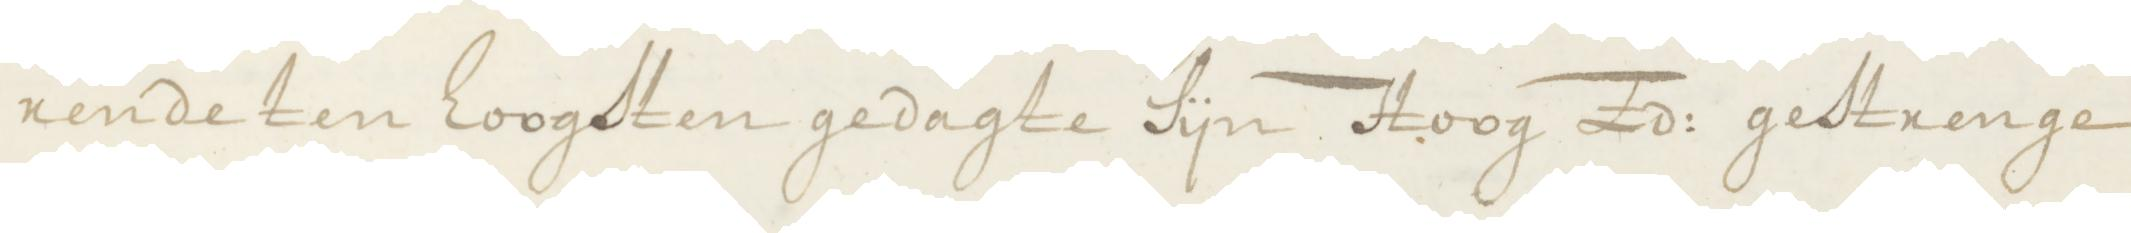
rende ten hoogsten gedagte sijn Hoog Ed: gestrenge
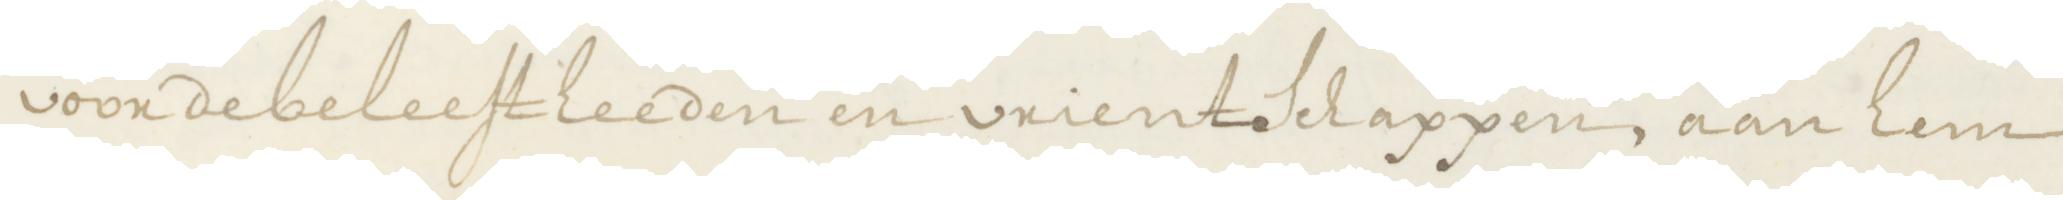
voor de beleeftheeden en vrientschappen, aan hem
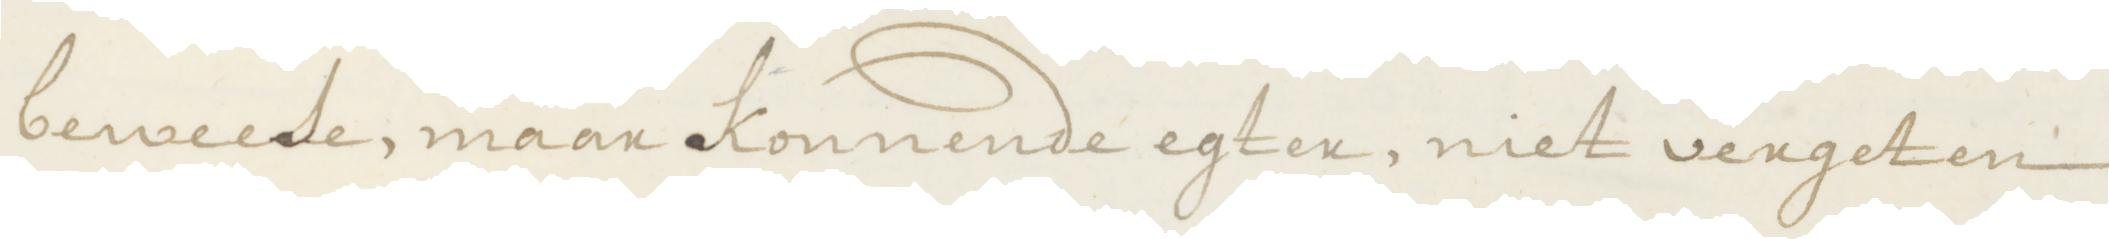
beweese, maar konnende egter, niet vergeten
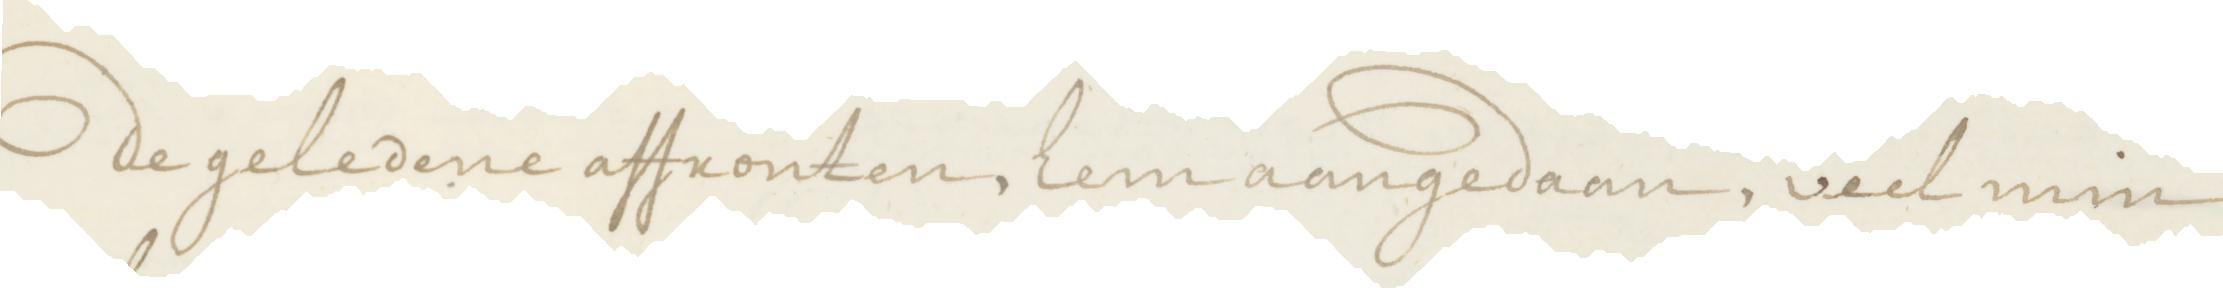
de geledene affronten, hem aangedaan, veel min
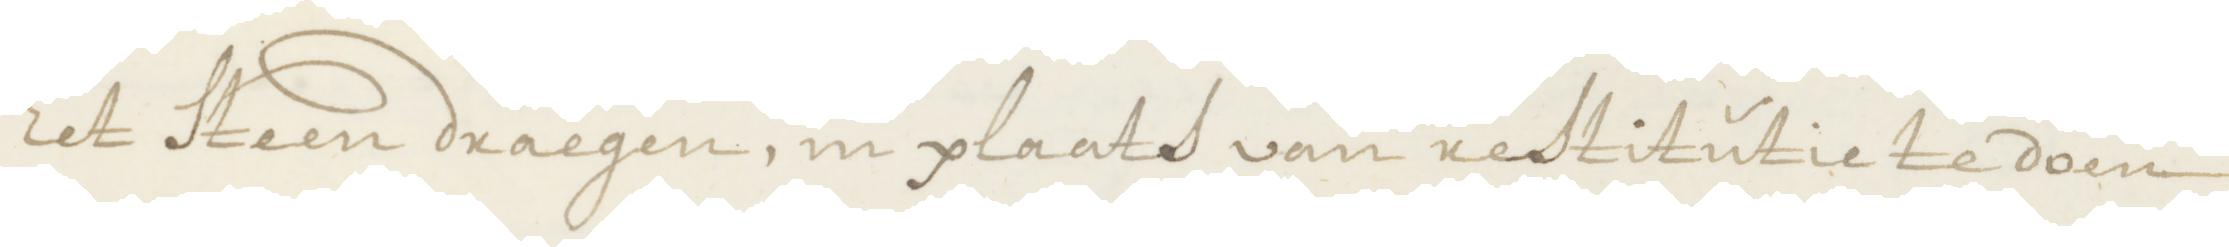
het steen draegen, in plaats van restitutie te doen
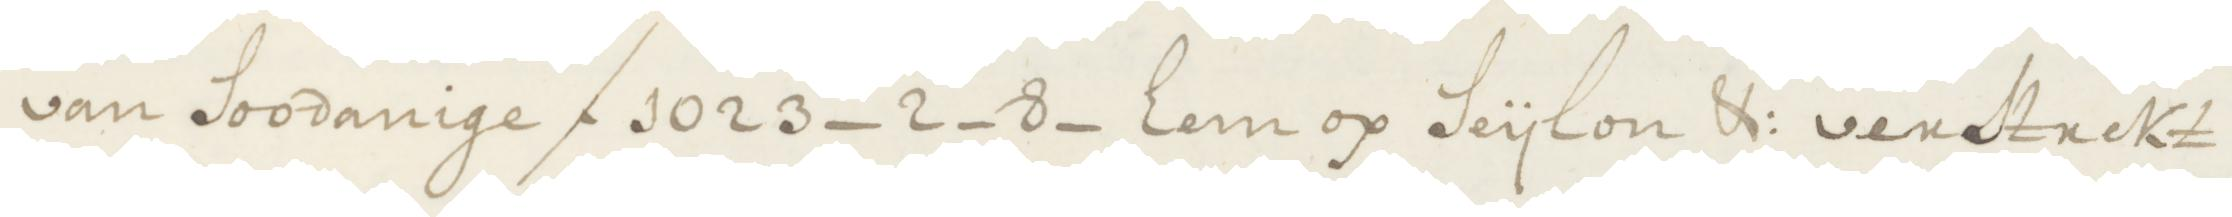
van soodanige ƒ 1023—2—8— hem op seijlon &: verstrekt
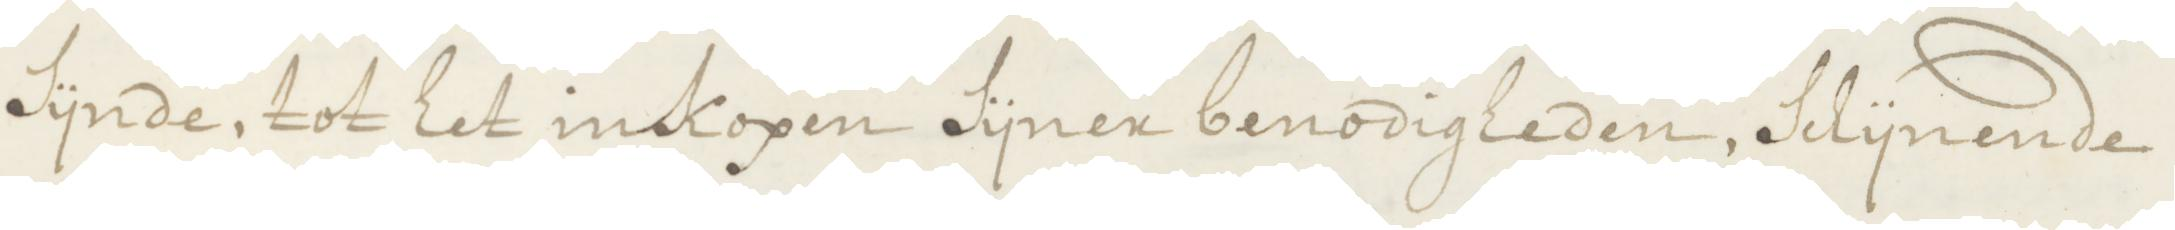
sijnde, tot het inkopen sijner benodigheden, schijnende
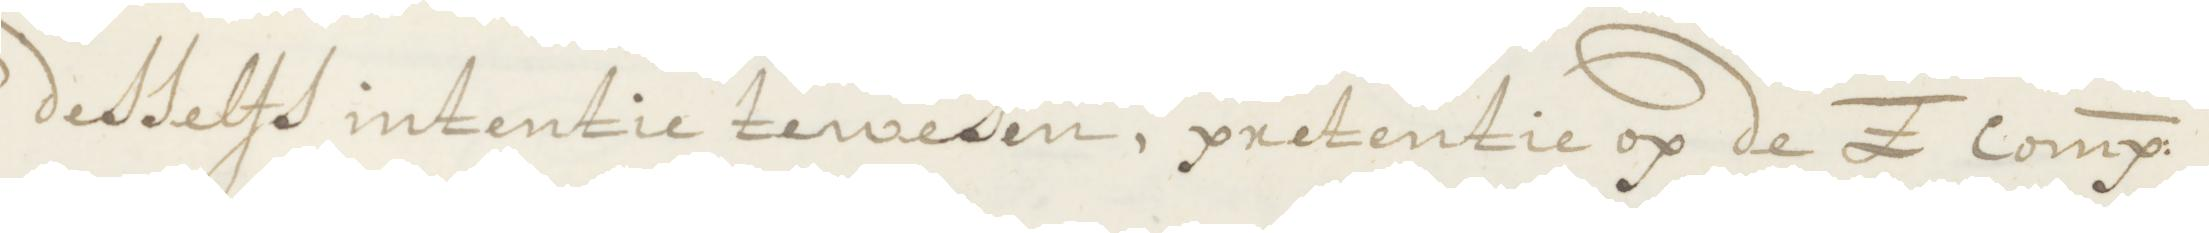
desselfs intentie te wesen, pretentie op de E Comp:
